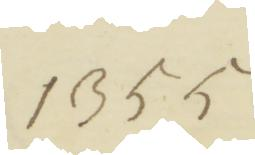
1355
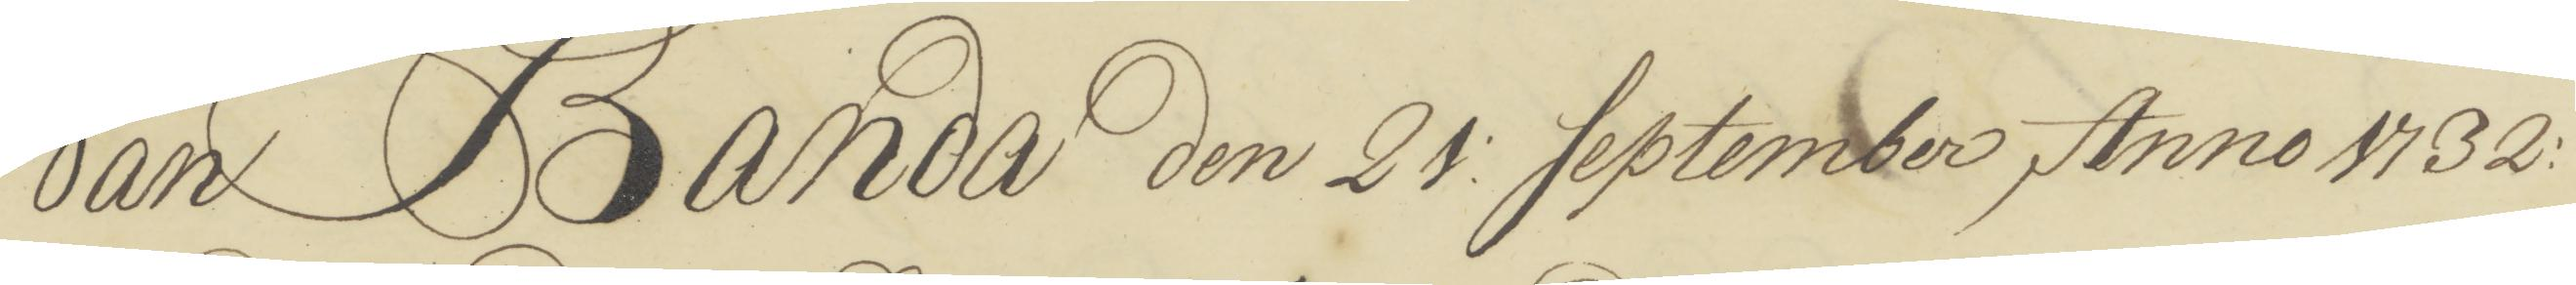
Van Banda den 21: september, Anno 1732:
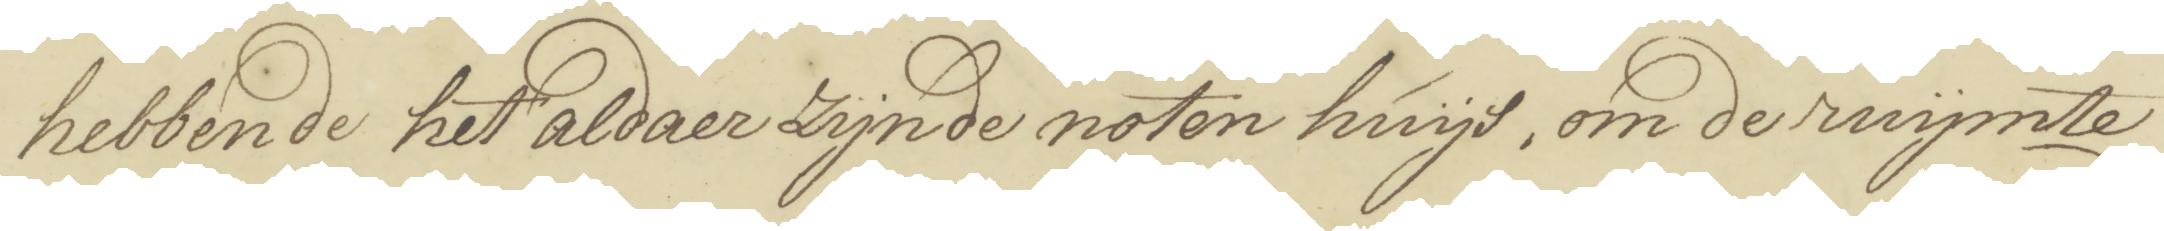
hebbende het aldaer zijnde noten huijs, om de ruijmte
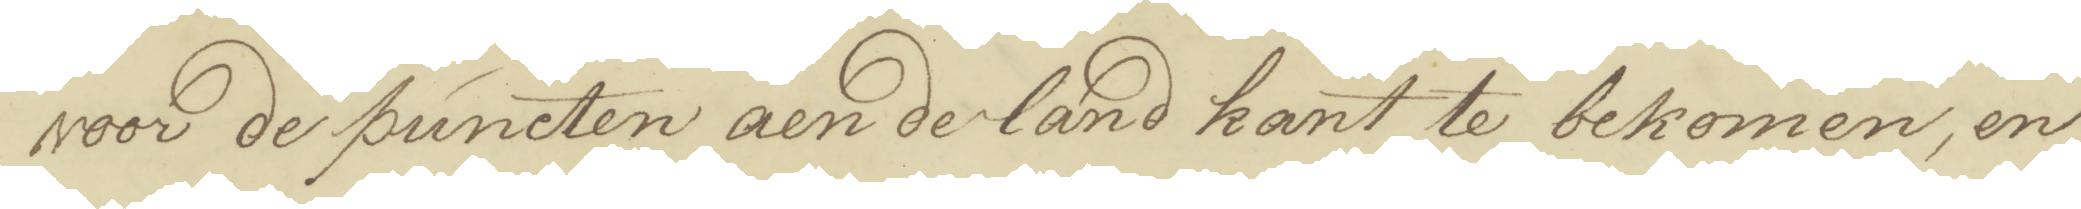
voor de puncten aen de land kant te bekomen, en
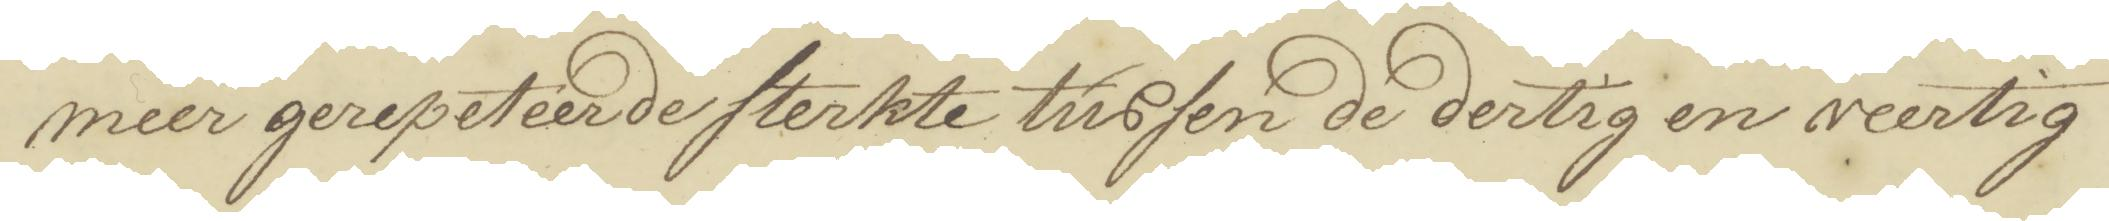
meer gerepeteerde sterkte tussen de dertig en veertig
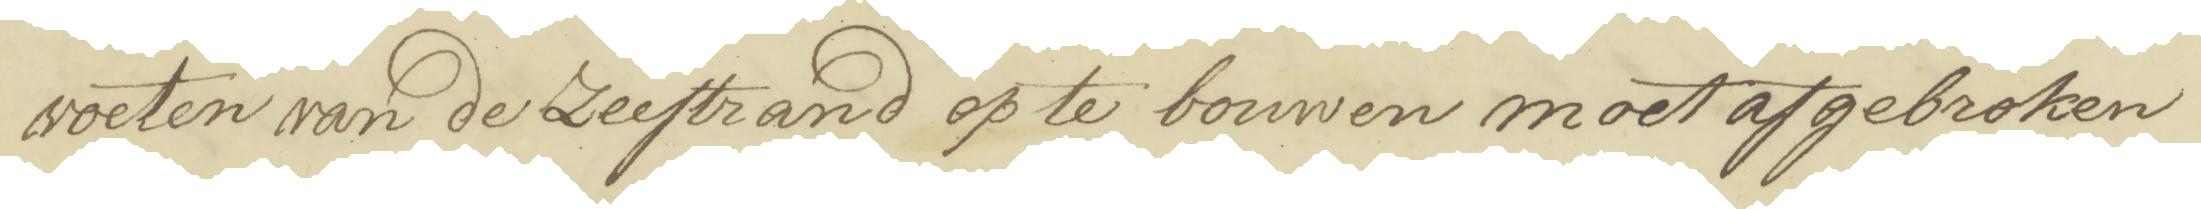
voeten van de Zeestrand op te bouwen moet afgebroken
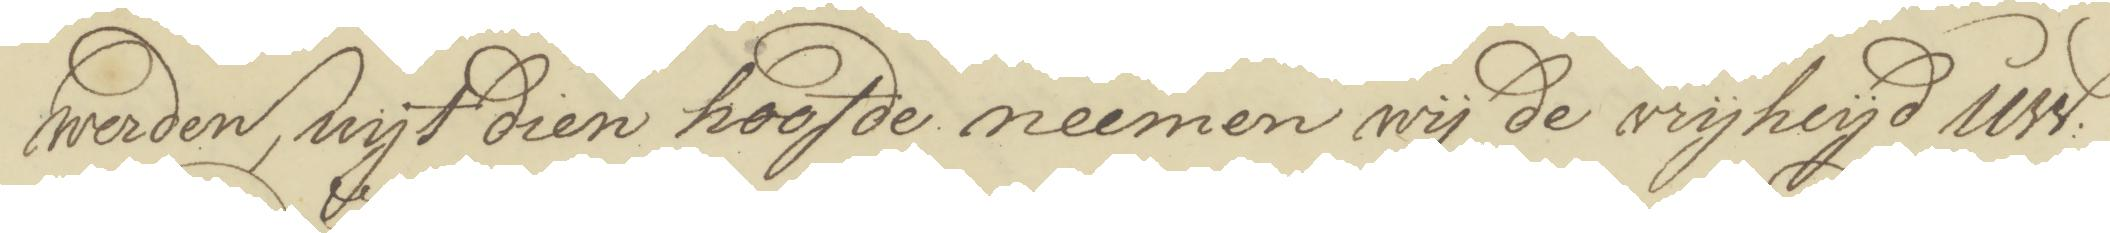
werden, uijt dien hoofde neemen wij de vrijheijd UW:
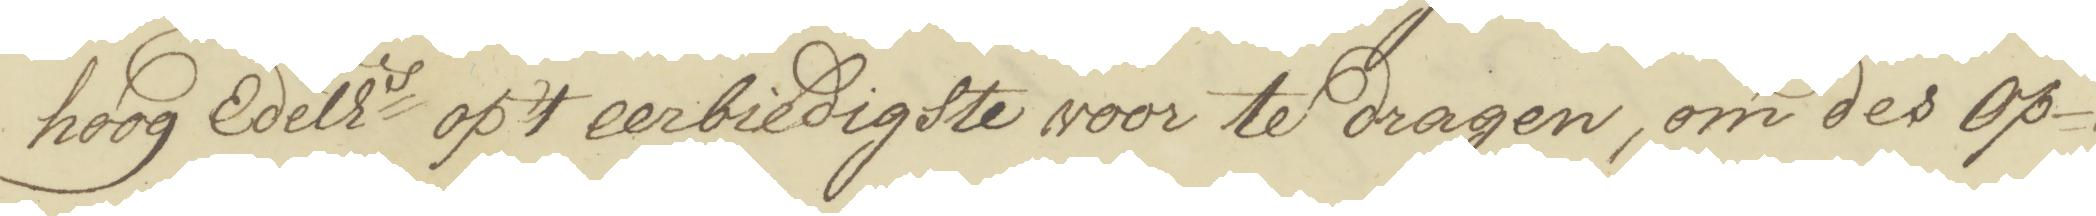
hoog Edelh=s op ’t eerbiedigste voor te dragen, om des Op=
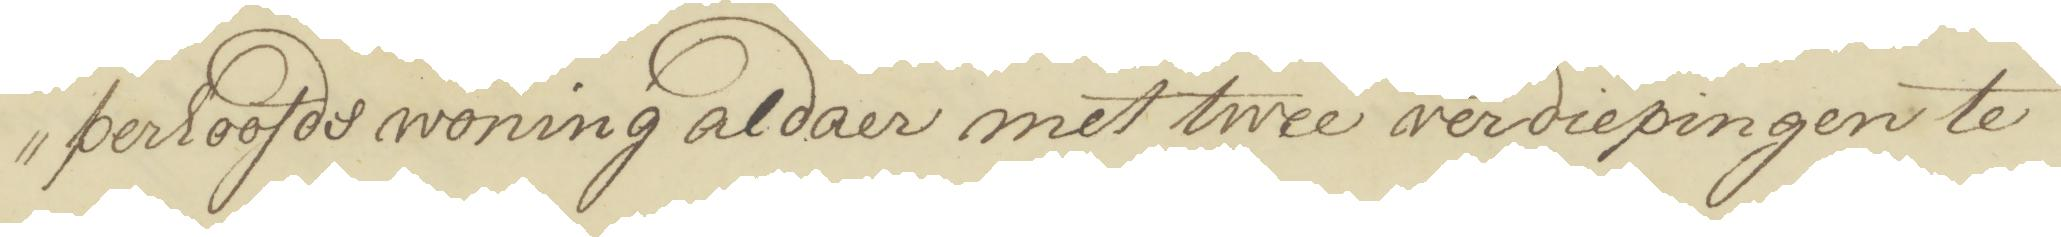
„perhoofds woning aldaer met twee verdiepingen te
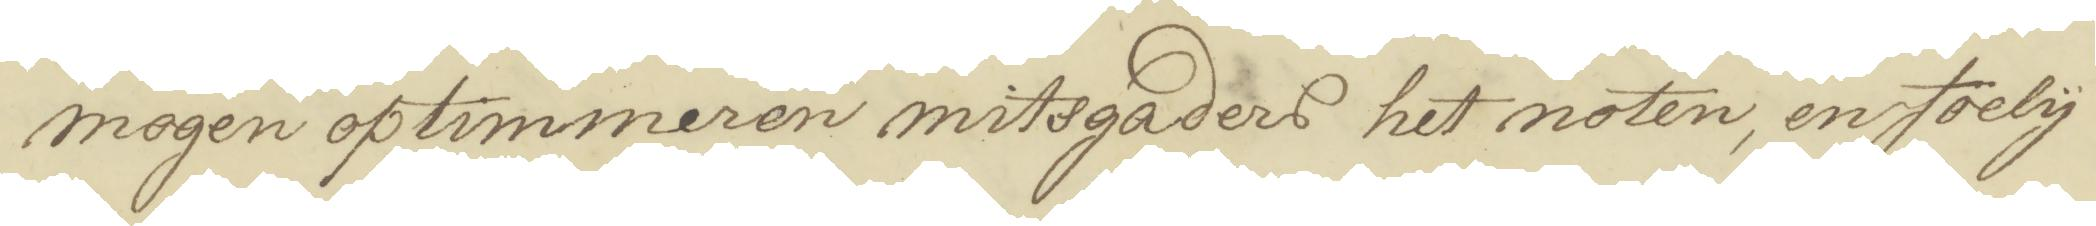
mogen op timmeren mitsgaders het noten, en foelij
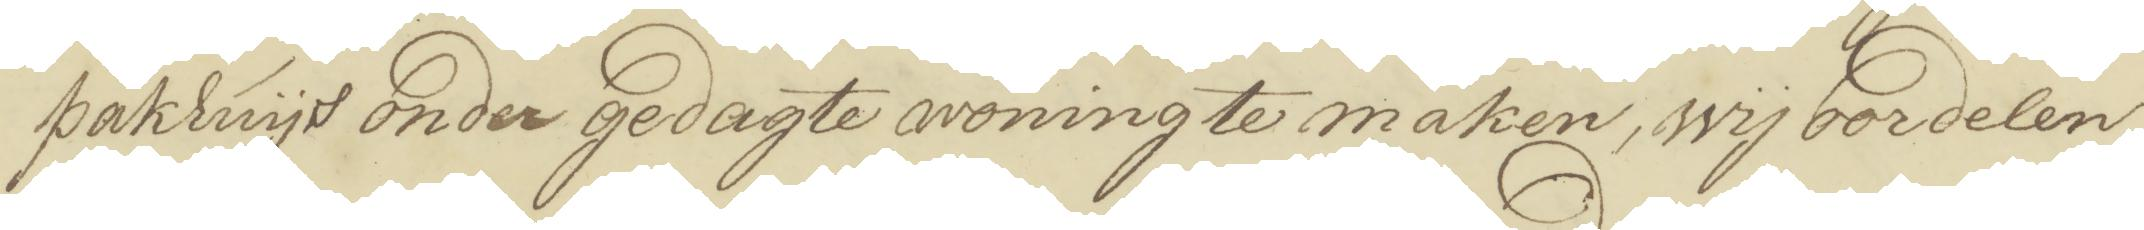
pakhuijs onder gedagte woning te maken, wij oordelen
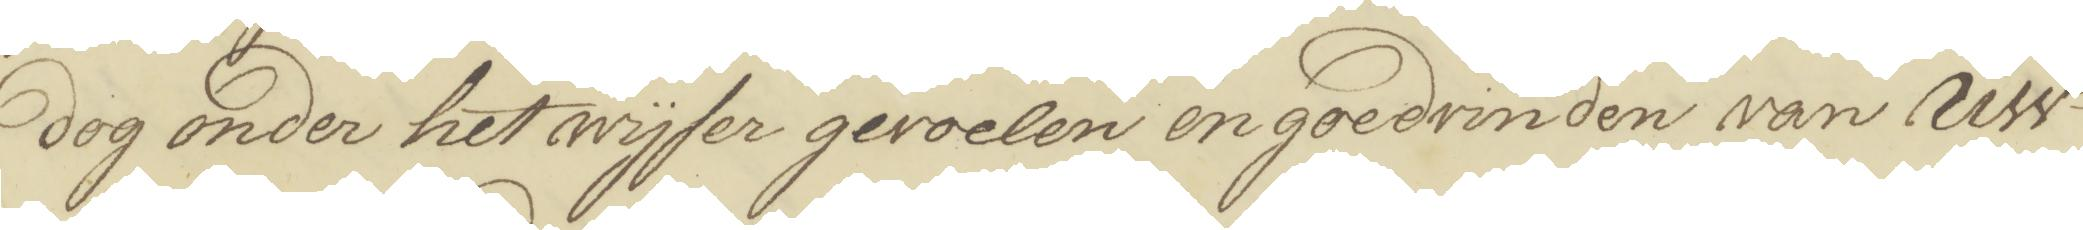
dog onder het wijser gevoelen en goedvinden van UW
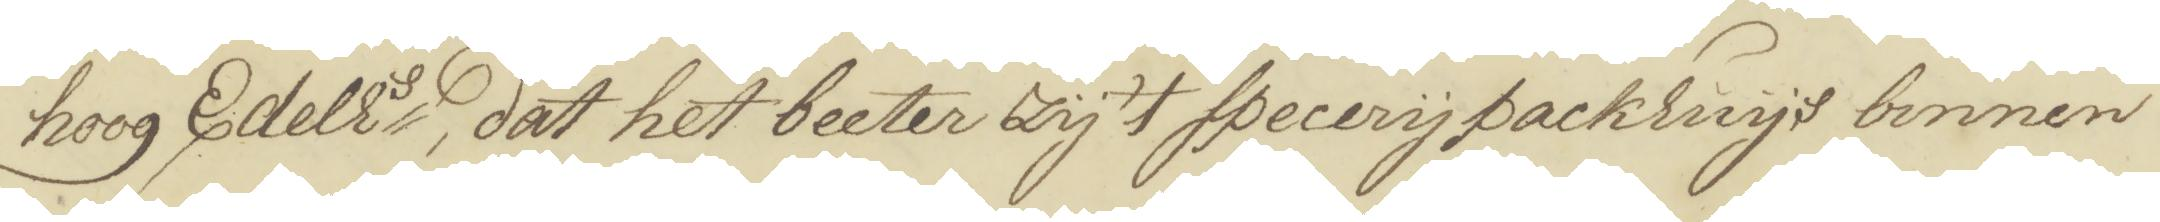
hoog Edelh„s, dat het beeter zij ’t specerij packhuijs binnen
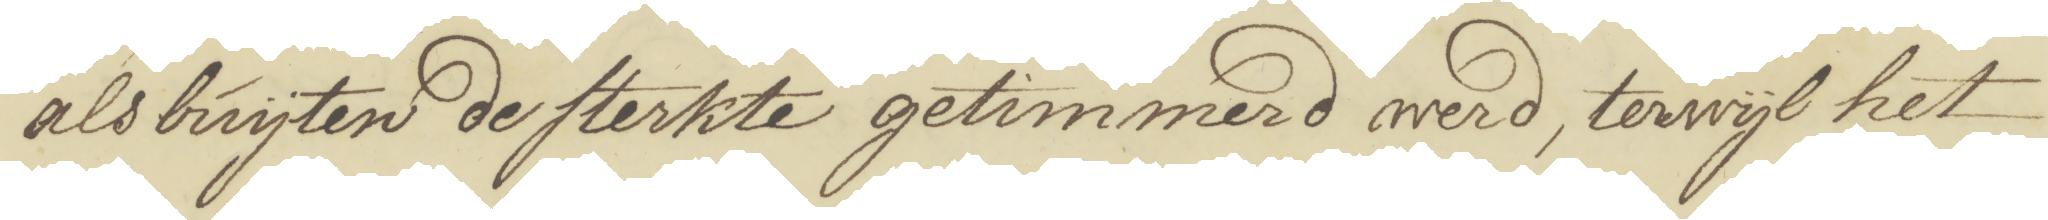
als buijten de sterkte getimmerd werd, terwijl het
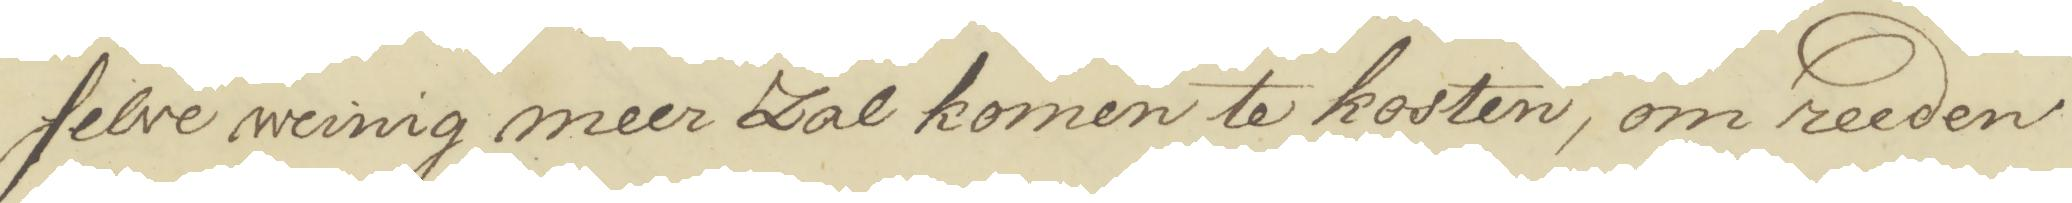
selve weinig meer zal komen te kosten, om reeden
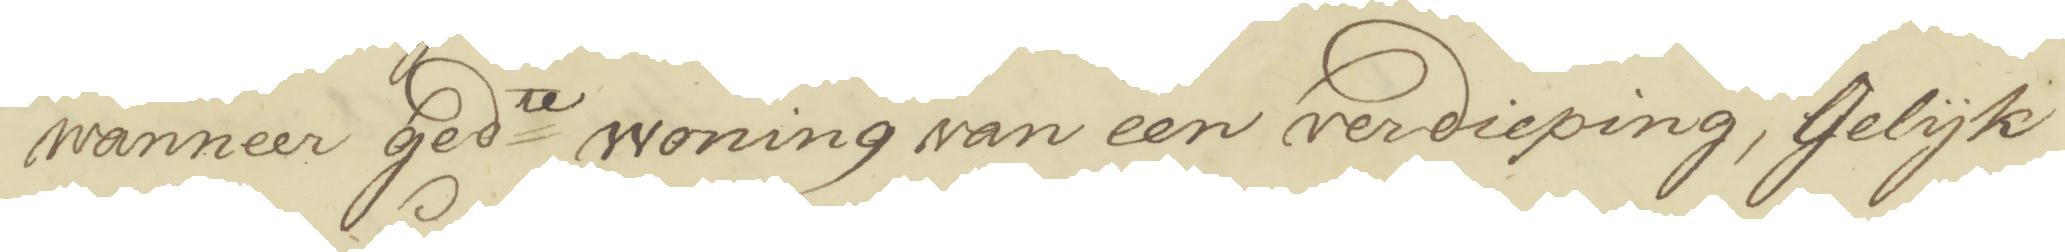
wanneer ged=te woning van een verdieping, Gelijk
